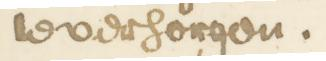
te versorgen.
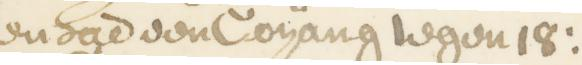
en had een Coijang tegen 18:
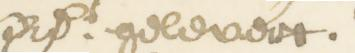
Rd„s gelevert.
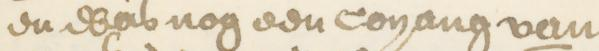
en was nog een coijang van
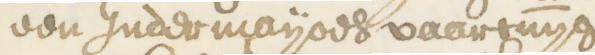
een Indermaijoes vaartuijg
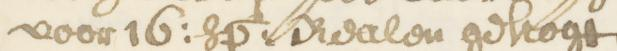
voor 16: sp: Realen gekogt
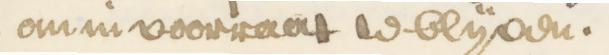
om in voorraat te blijven.
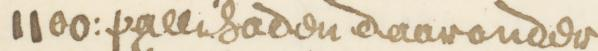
1100: pallisaden daaronder
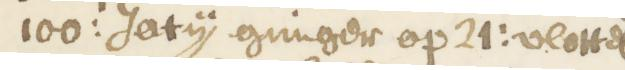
100: Jatij ginger op 21: vlot
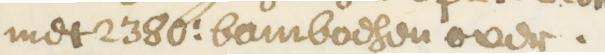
met 2380: bamboesen over.
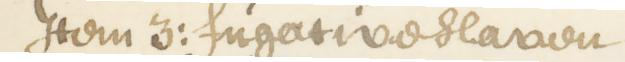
Item 3: fugative slaven
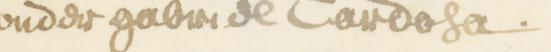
onder gabriel Cordosa
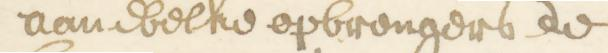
aan welke opbrengers de
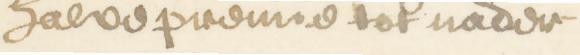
halve premie tot nader
